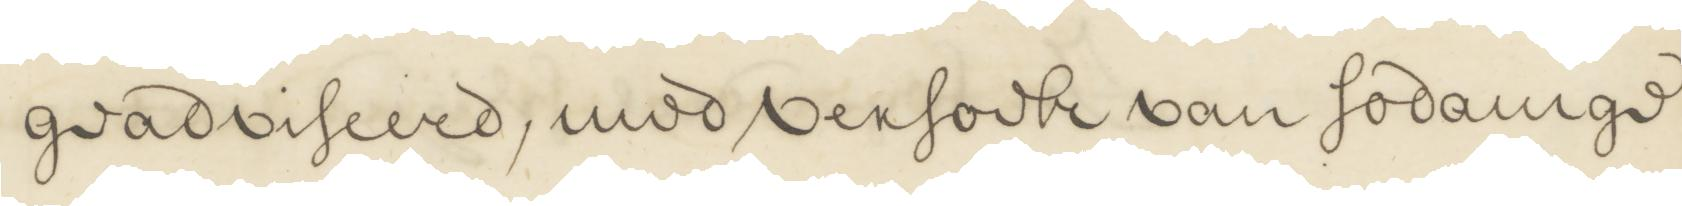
geadviseerd, med versoek van sodanige
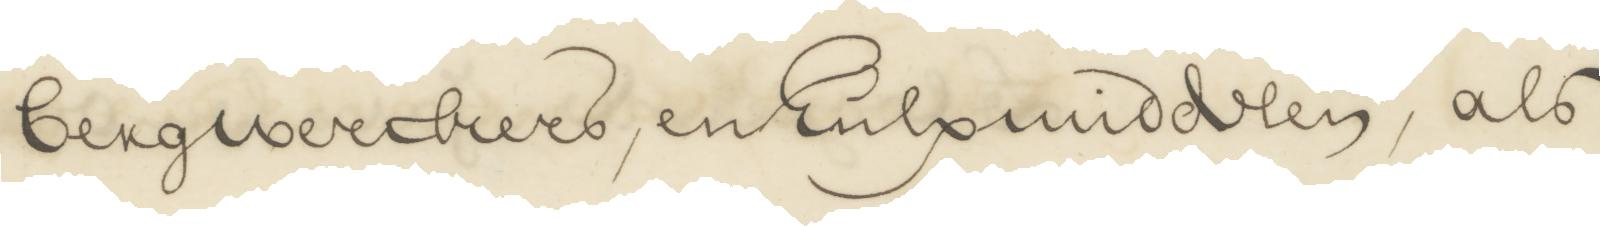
bergwerckers, en hulpmiddelen, als
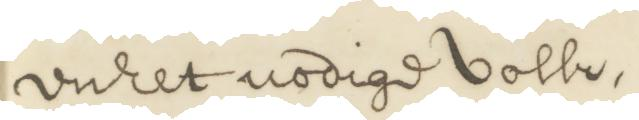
en het nodige volk,
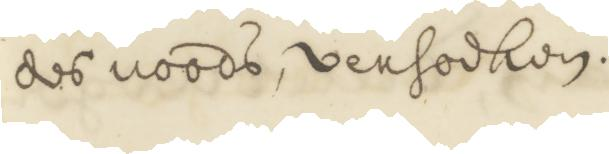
des noods, versoeken.
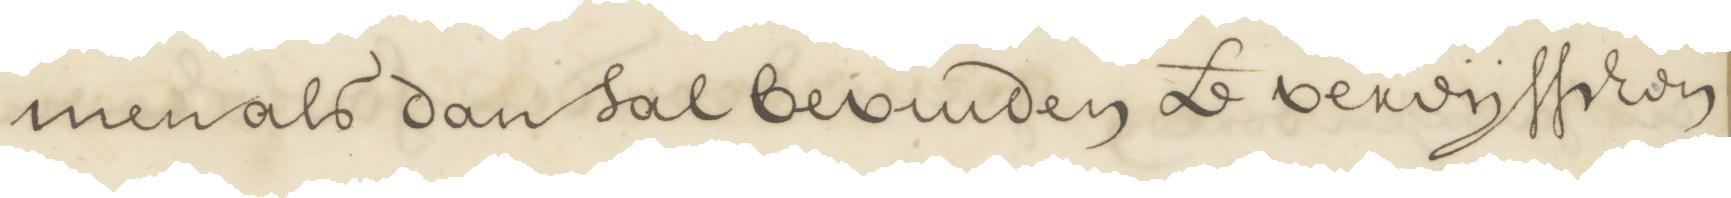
men als dan sal bevinden te vereijsschen
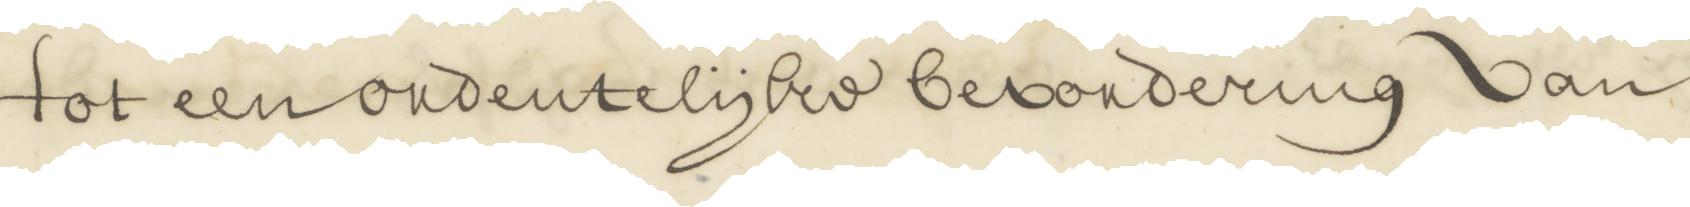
tot een ordentelijke bevordering van
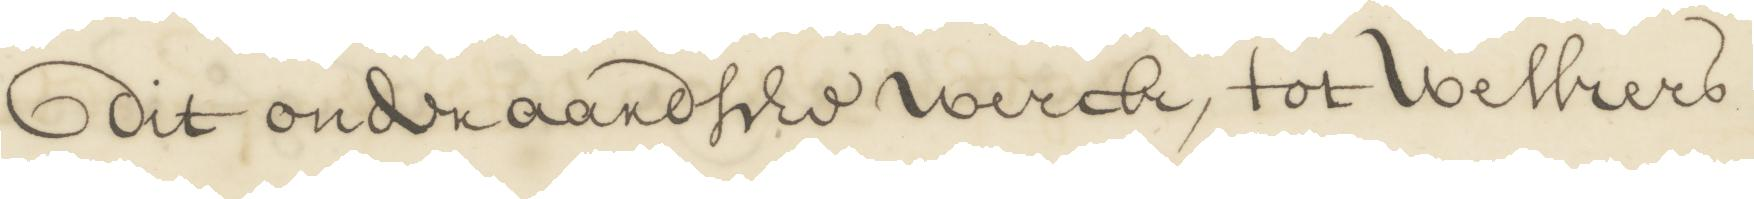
dit onderaardsche werck, tot welkers
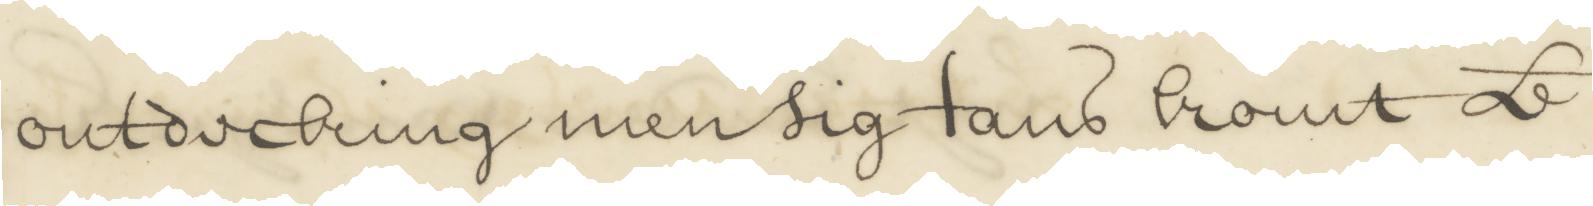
ontdecking men sig tans komt te
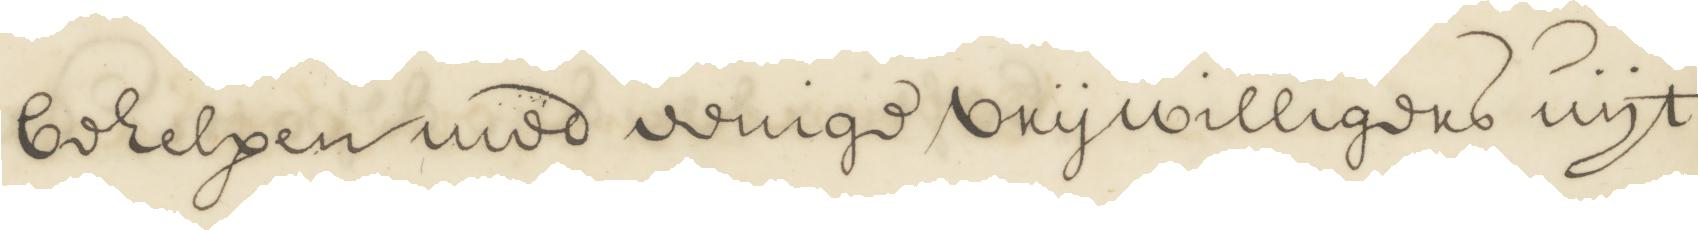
behelpen med eenige vrijwilligers uijt
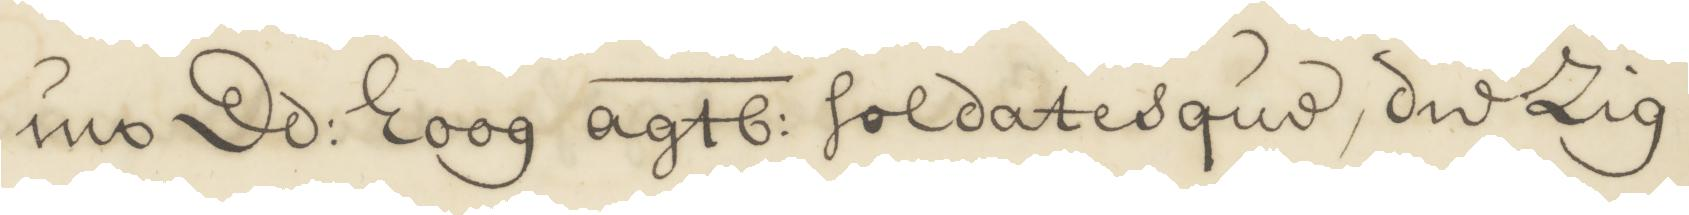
uw Ed: hoog agtb: soldatesque, die Zig
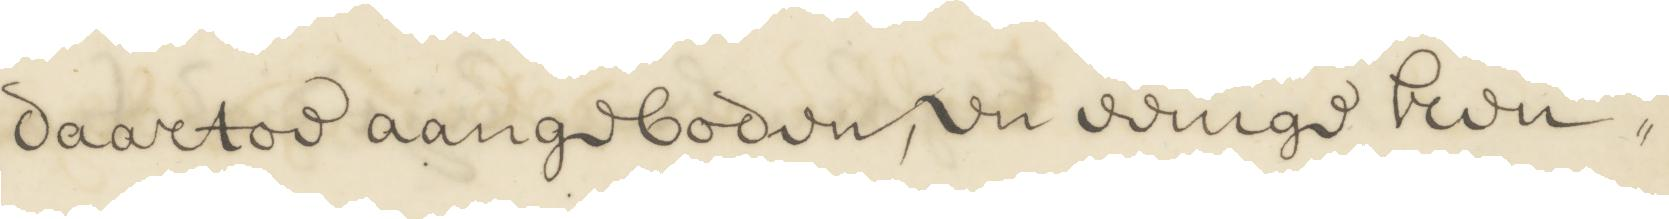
daartoe aangeboden, en eenige ken„
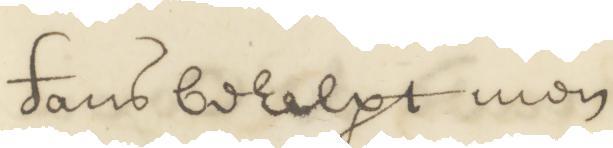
tans behelpt men
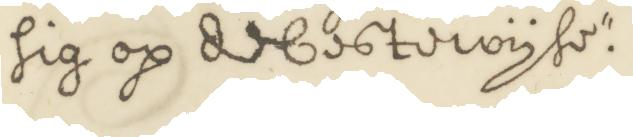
sig op de beste wijse".
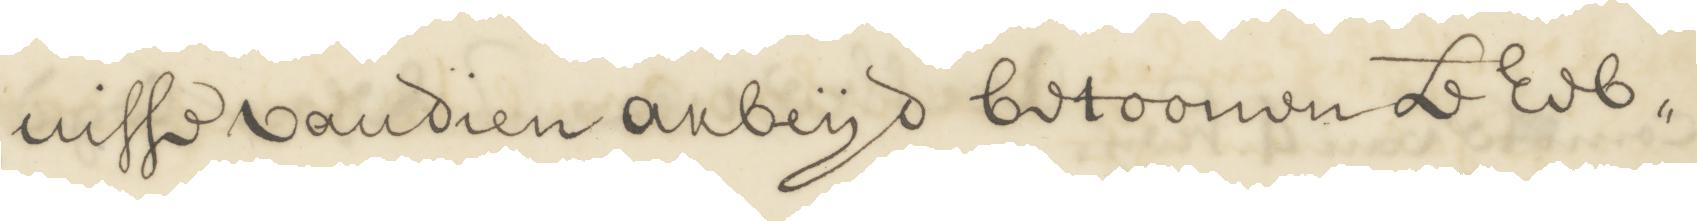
nisse van dien arbeijd betoonen te heb„
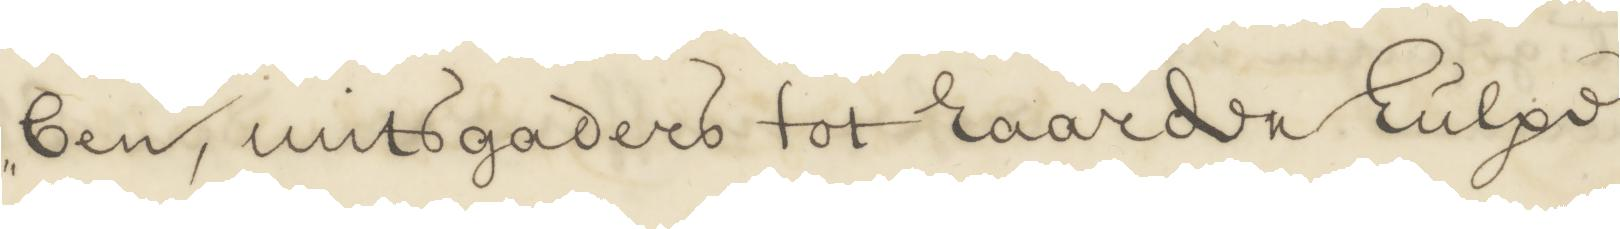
„ben, mitsgaders tot haarder hulpe
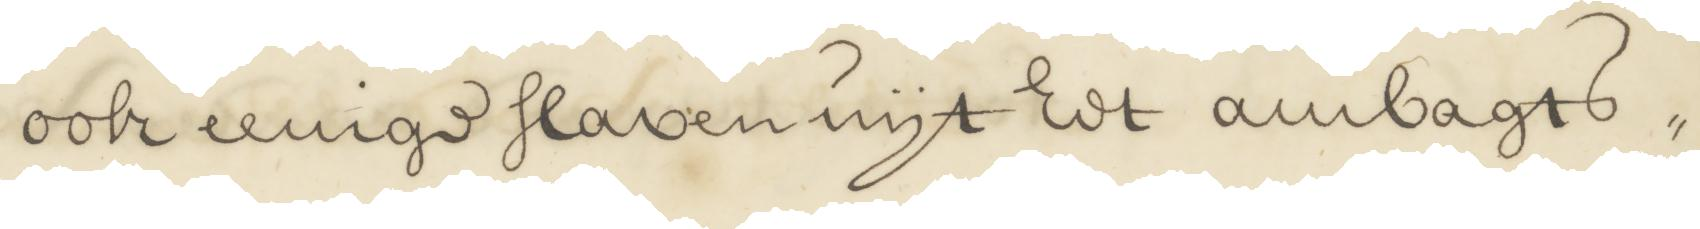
ook eenige slaven uijt het ambagts„
